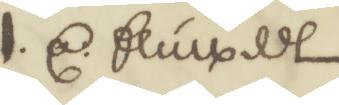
1. @: fluweel
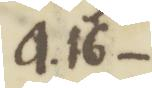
4.16 –
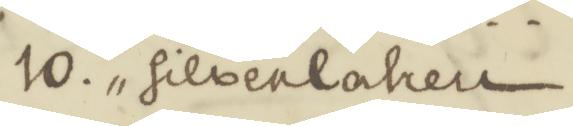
10. „ silverlaken
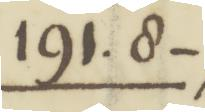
191. 8 –
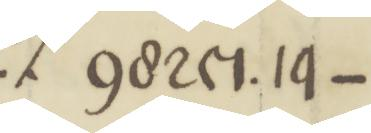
ƒ 98251.14 –
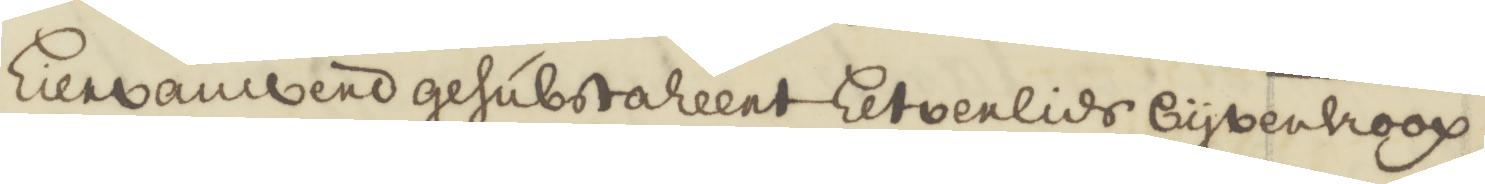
hiervan werd gesubstaheert het verlies bij verkoop
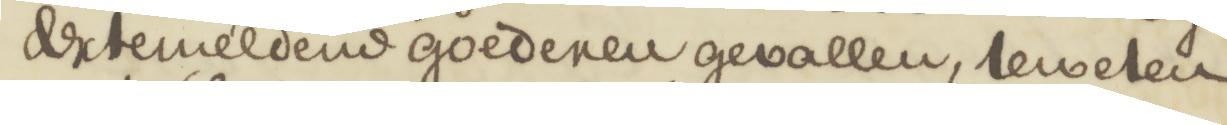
der temeldene goederen gevallen, teweten
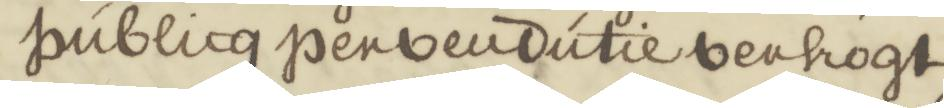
publicq per vendutie verkogt
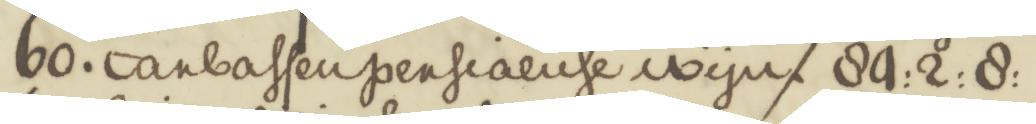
60. carbassen persiaense wijn ƒ 84:2:8:
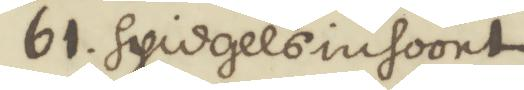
61. spiegels in soort
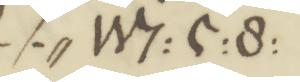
- „ 117:5:8:
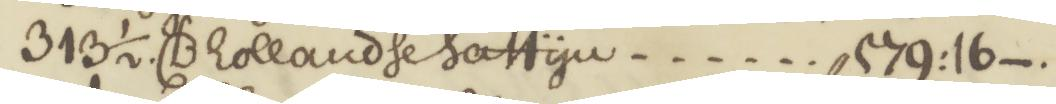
313½. Cl hollandse sattijn - - - - - - „579: 16 -
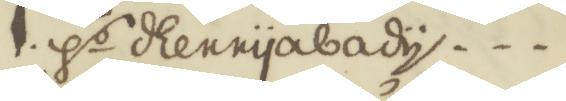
1. p=s dherrijabadij - - -
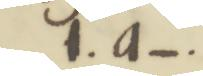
1. 4 –
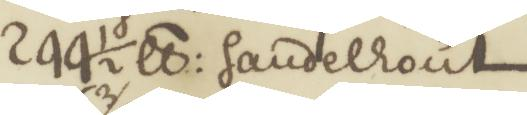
244½ lb: sandelhout
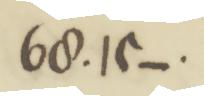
68.15 – .
